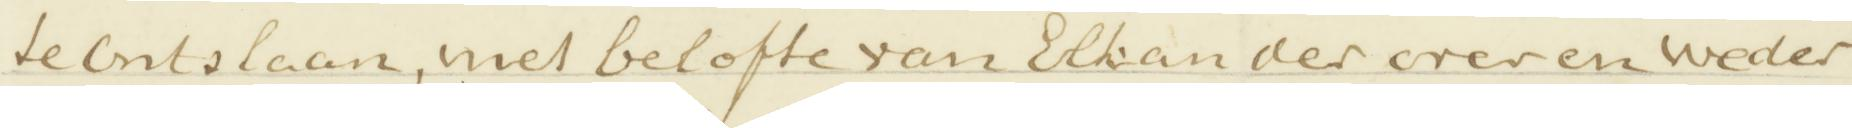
te ontslaan, met belofte van Elkander over en weder
